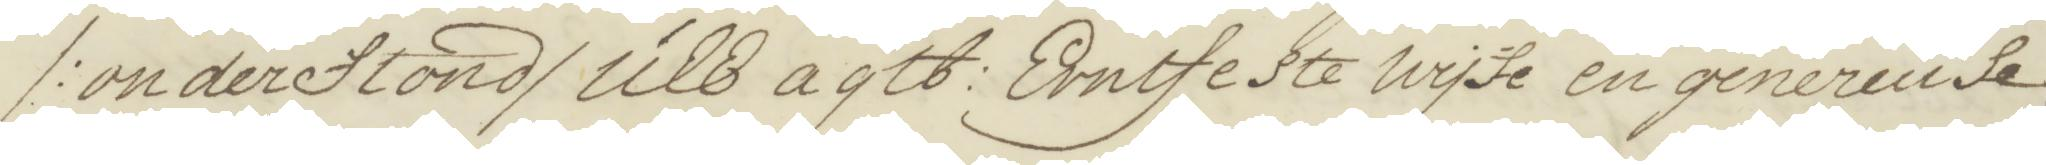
/:onderstond/ uEE agtb: Erntfeste wijse en genereuse
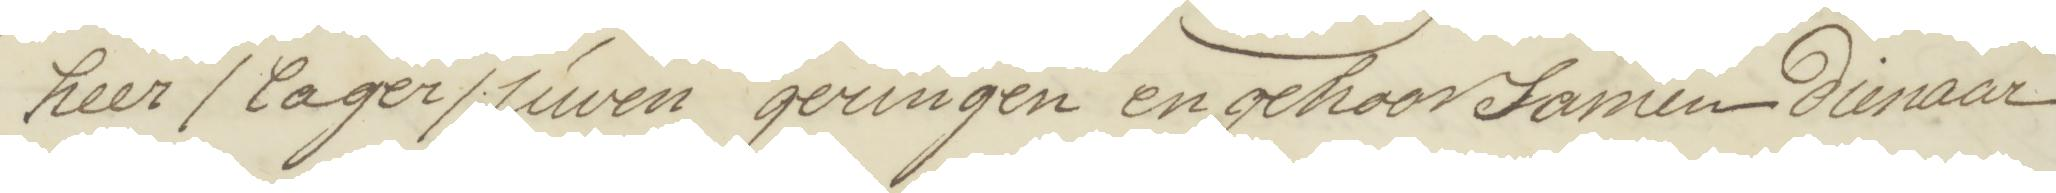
heer / lager /: uwen geringen en gehoorsamen dienaar
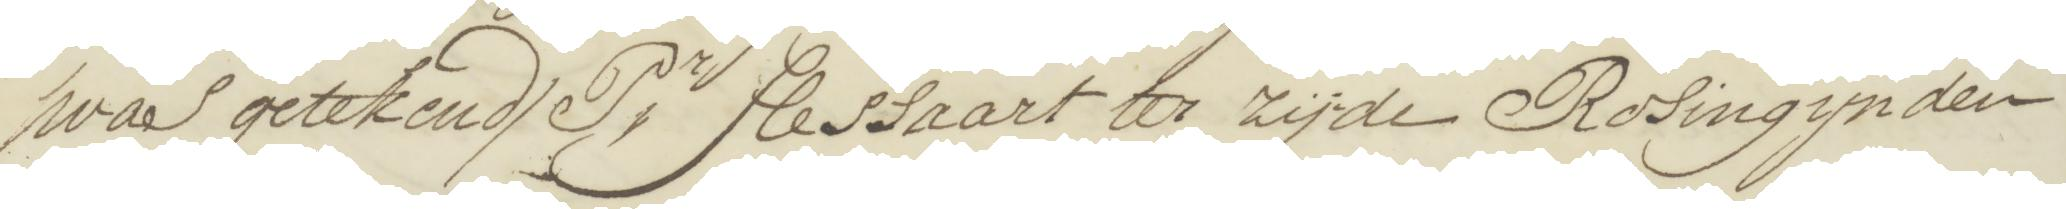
/was getekend/ P„r Flessaart ter zijde Rosing yn den
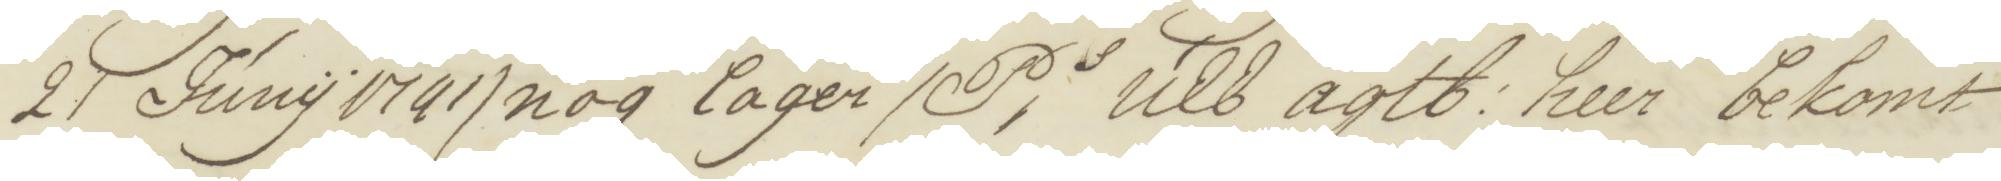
21 Junij 1741/nog lager/ P„s uEE agtb: heer bekomt
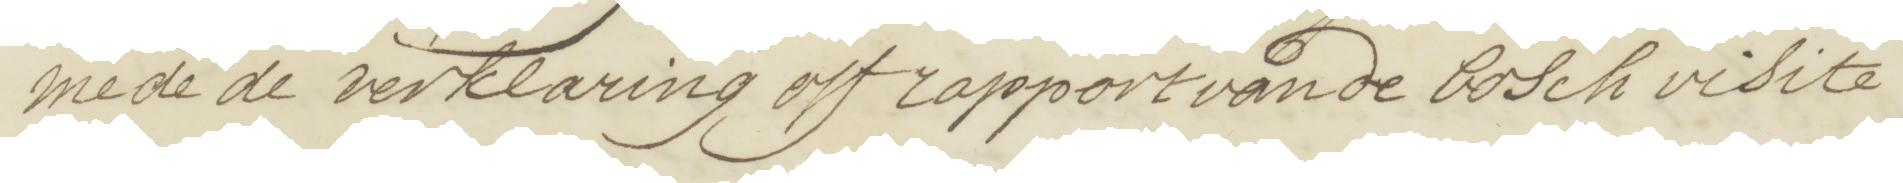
mede de verklaring off rapport van de bosch visite
